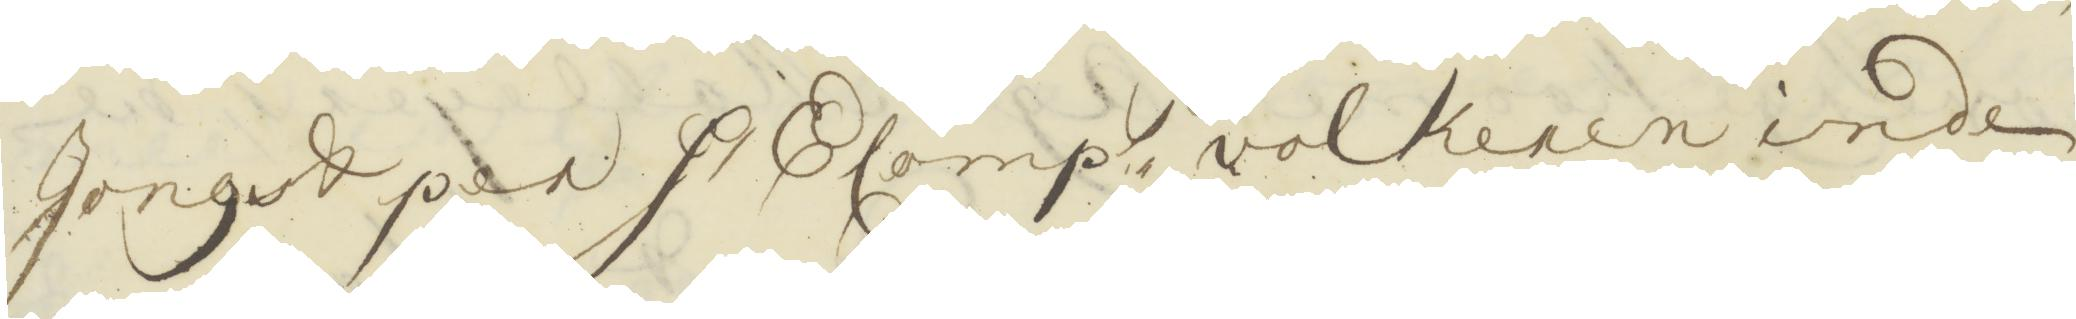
Jongsl per s'EComp:s volkeren in de
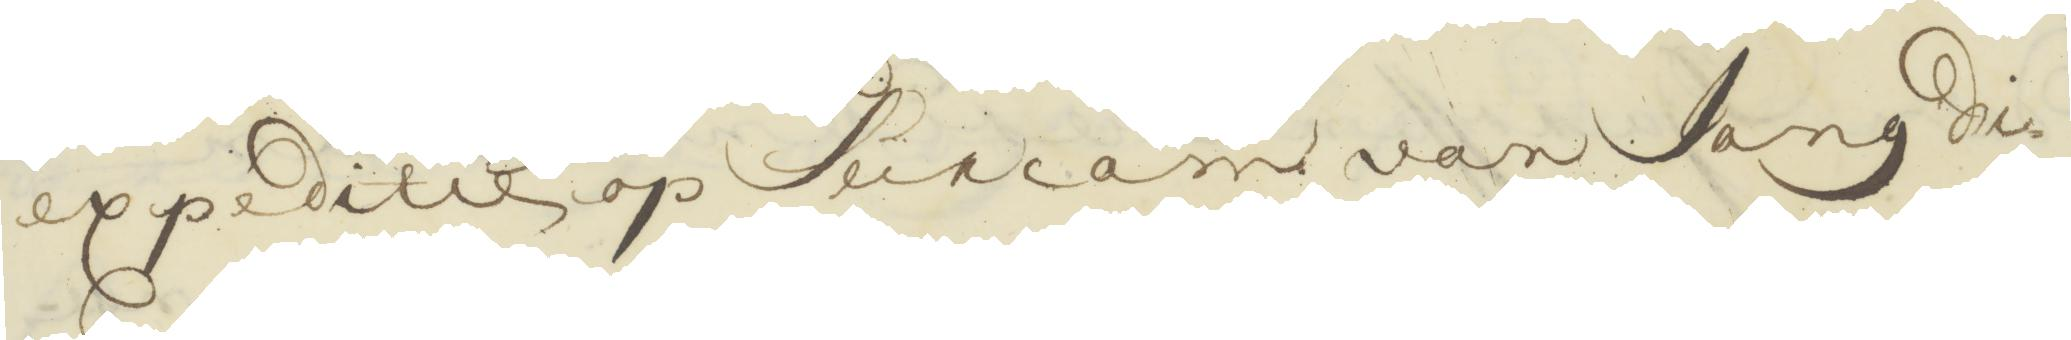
expeditie op Surcam van Iang di.
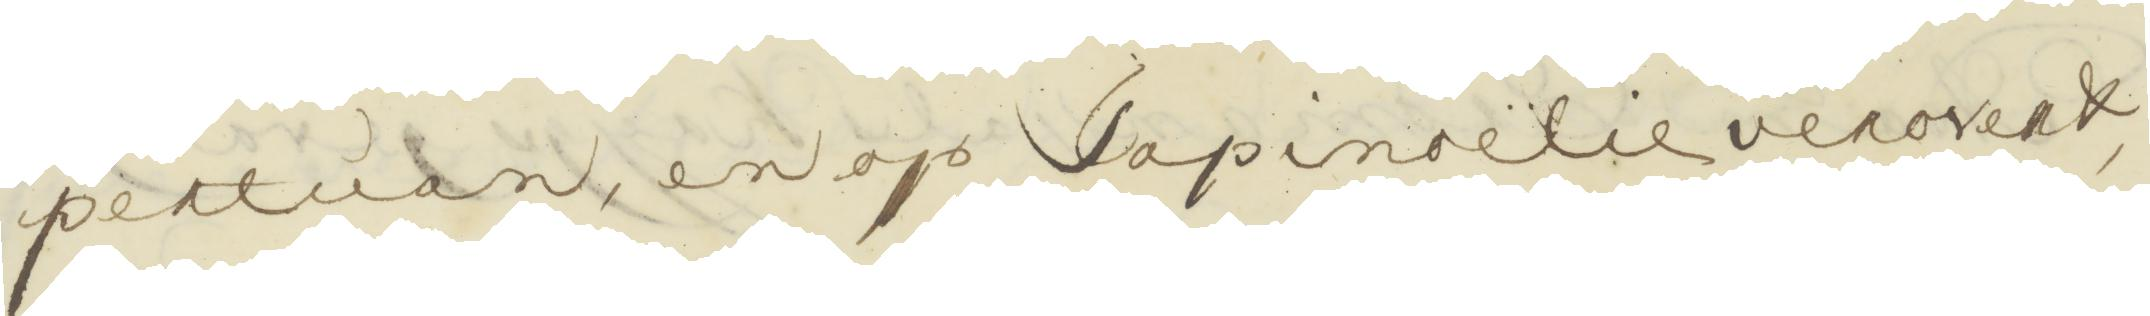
pertuan en op Tapinoëlie verovert,
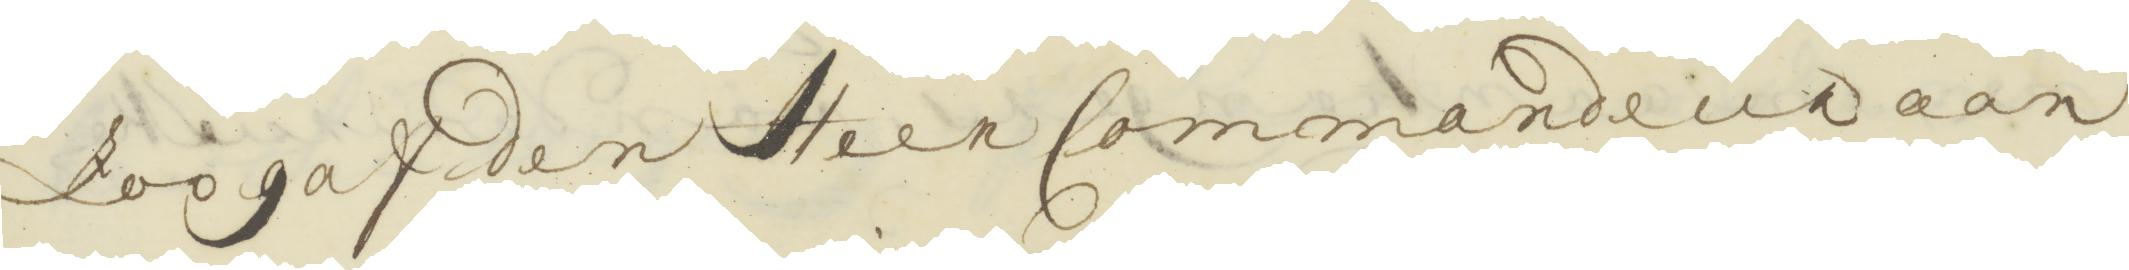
zoo gaf den Heer Commandeur aan
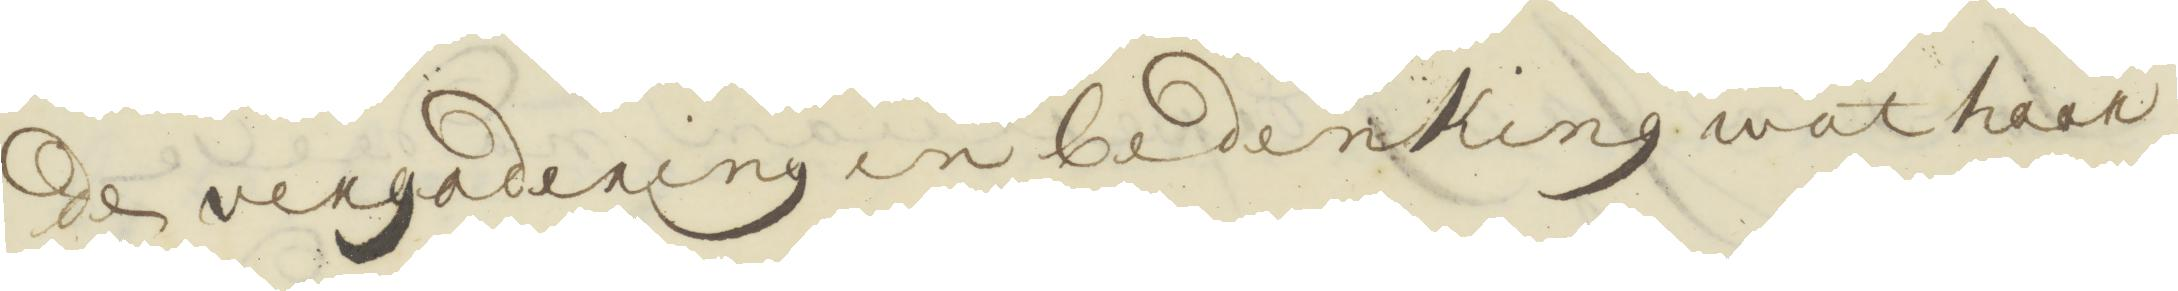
de vergadering in bedenking wat haar
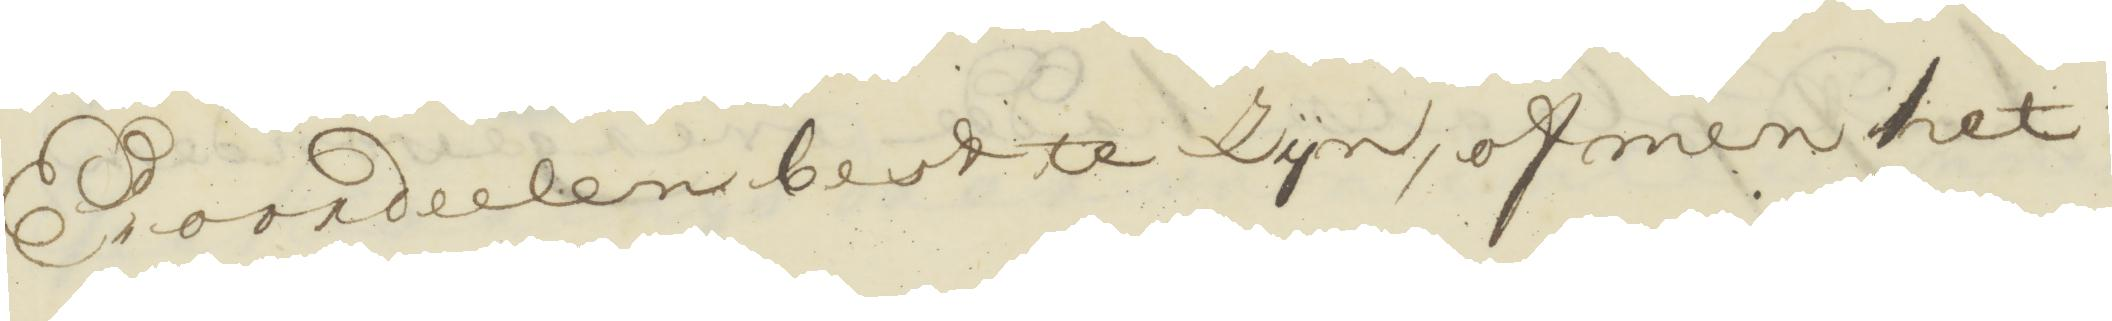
E„d oordeelen best te zijn, of men het
